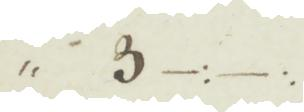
„ 3 —: —:
